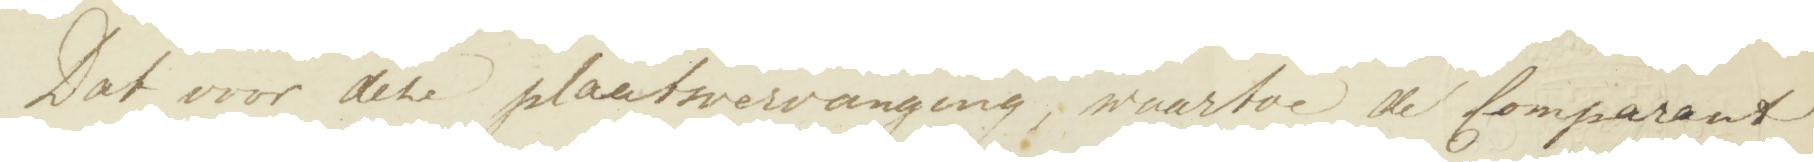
Dat voor deze plaatsvervanging, waartoe de Comparant
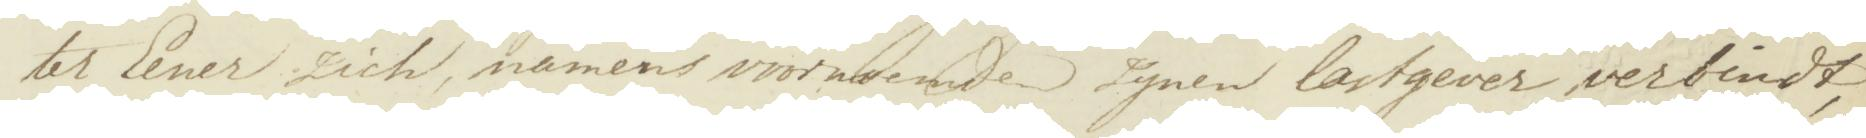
ter Eener zich, namens voornoemde zynen lastgever, verbindt,
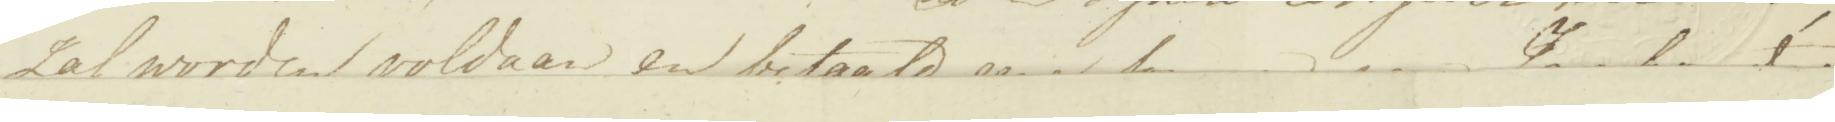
zal worden voldaan en betaald
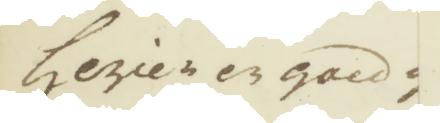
Gezien en goed
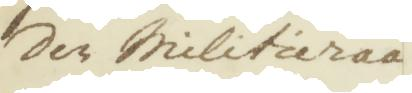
den militieraa
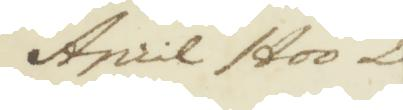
April 1800
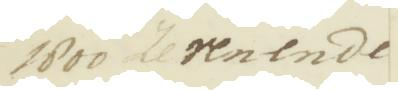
1800 Zeven ende
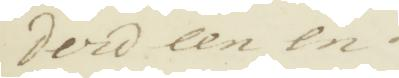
derd een en
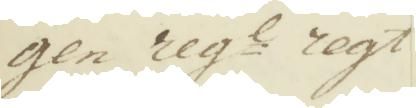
gen reg=l regt
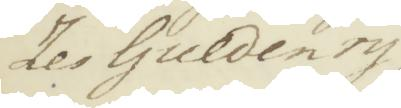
Zes Gulden vy
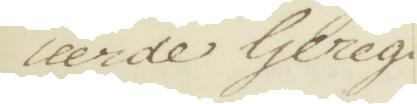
ieerde Gereg
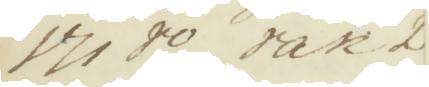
171 d=o vak
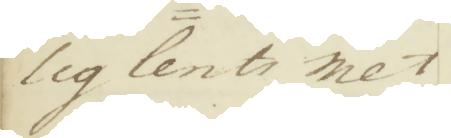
tig Cents met
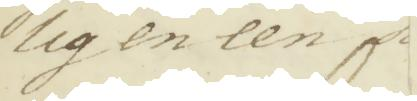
tig en een
